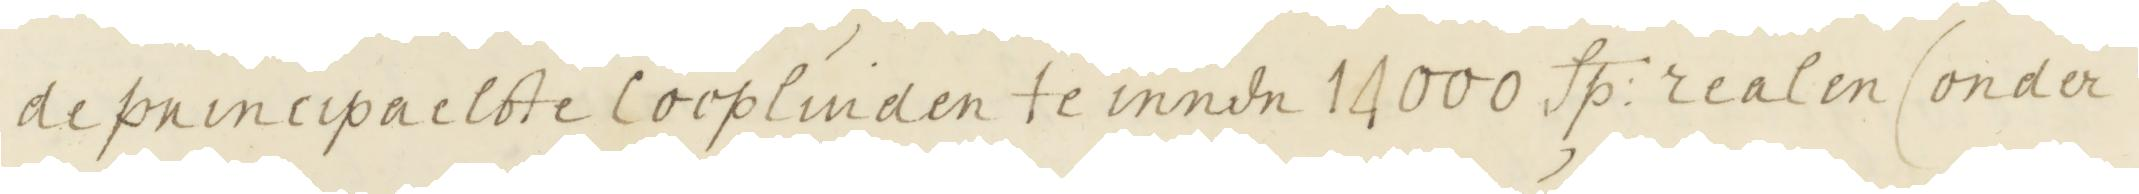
de principaelste Coopluiden te innen 14000 sp: realen (onder
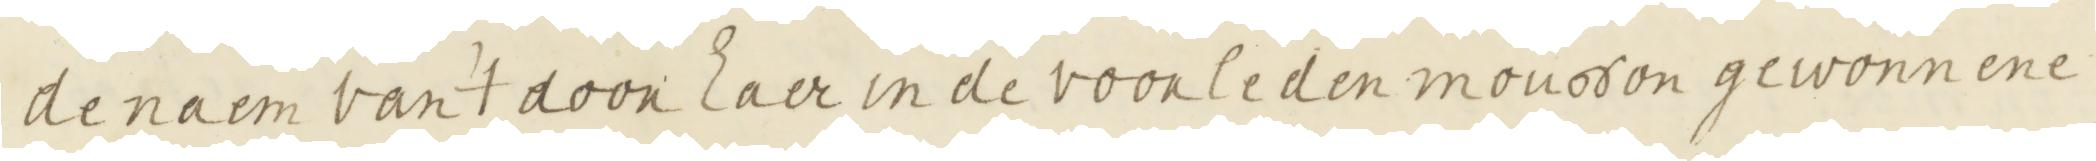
de naem van ’t door haer in de voorleden mousson gewonnene
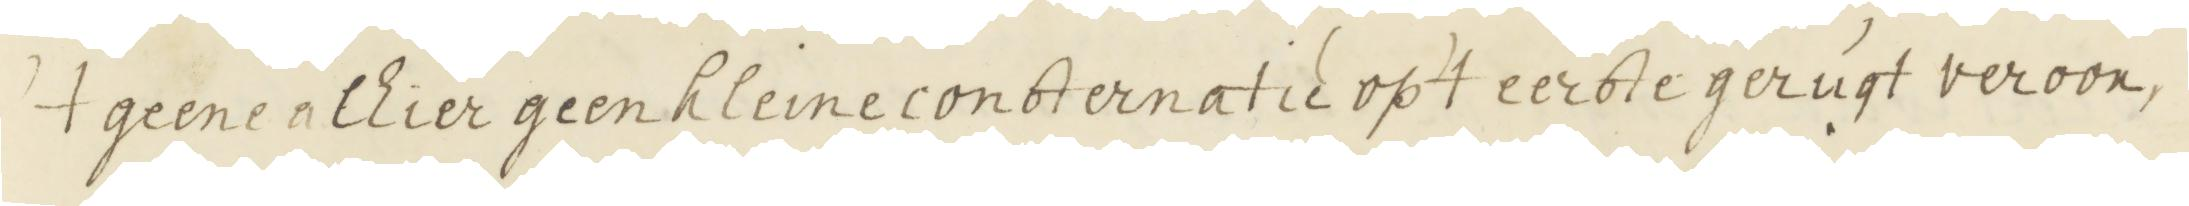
’t geene alhier geen kleine consternatie op ’t eerste gerugt veroor„
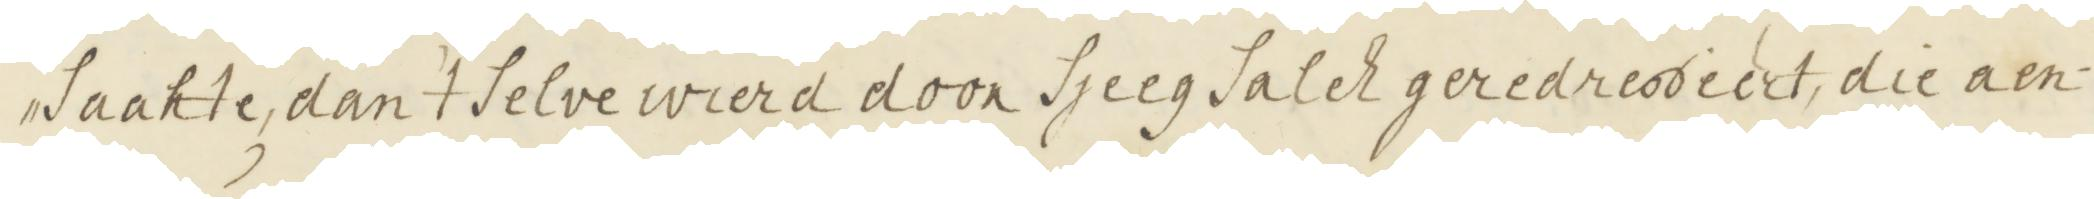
„saakte, dan ’t selve wierd door sjeeg saleh geredresseert, die aen-
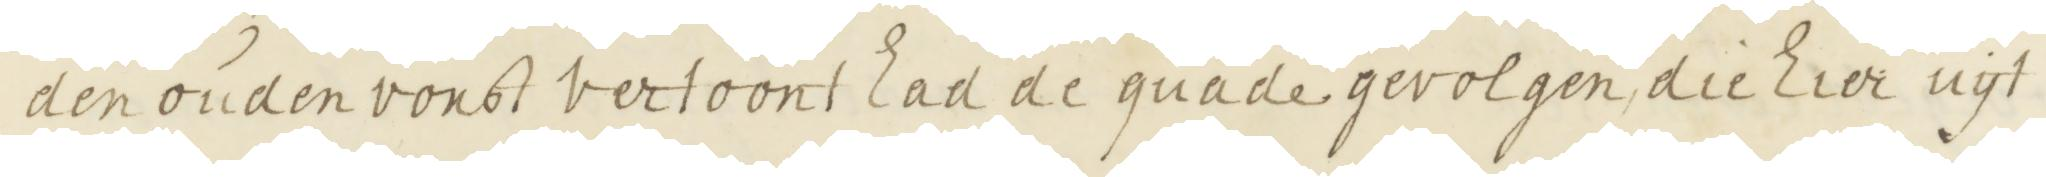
den ouden vorst vertoont had de quade gevolgen, die hier uijt
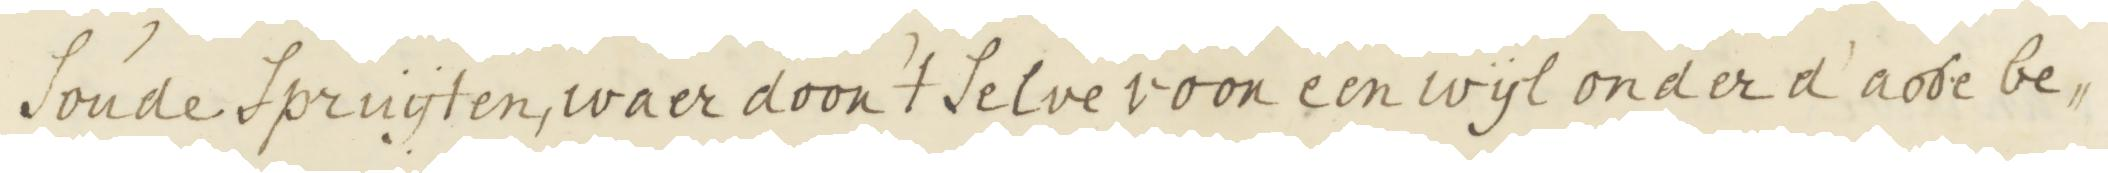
soude spruijten, waer door ’t selve voor een wijl onder d' asse be„
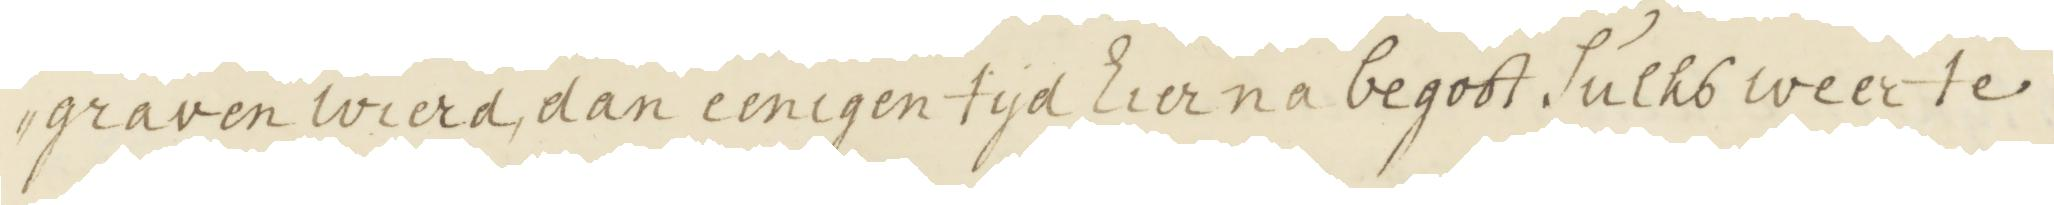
„graven wierd, dan eenigen tijd hier na begost sulks weer te
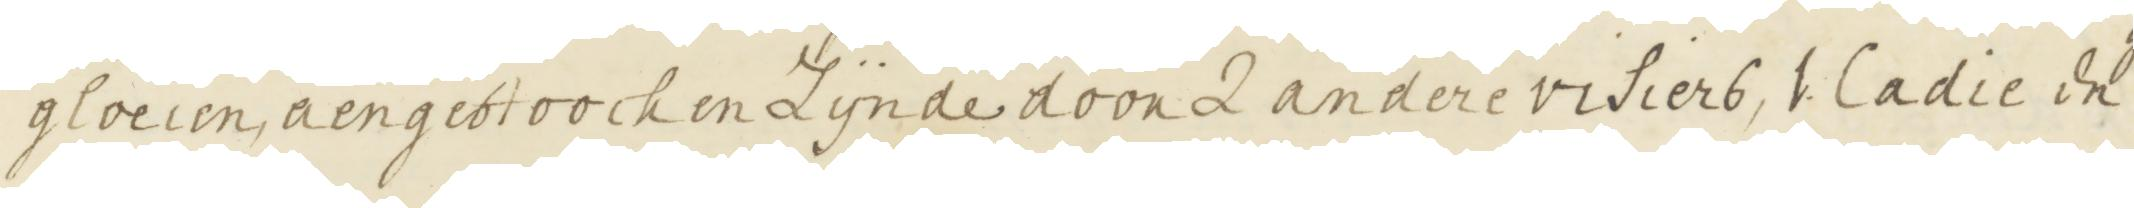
gloeien, aengestoocken zijnde door 2 andere visiers, 1. Cadie en
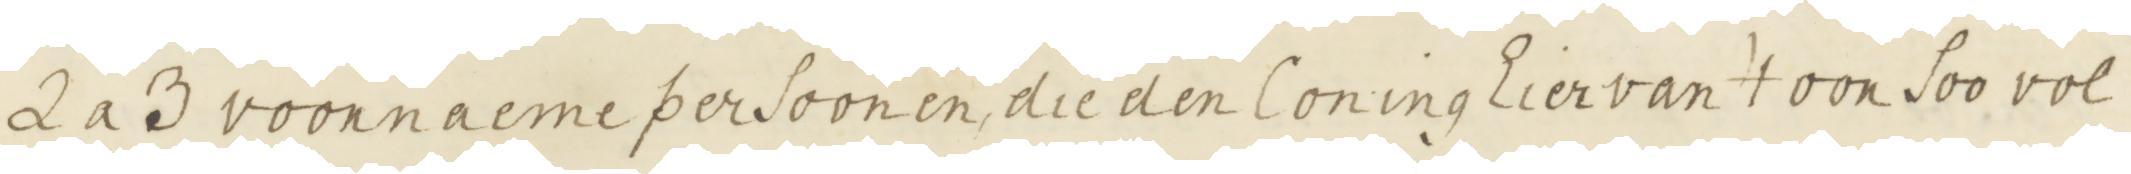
2 a 3 voornaeme persoonen, die den Coning hier van ’t oor soo vol
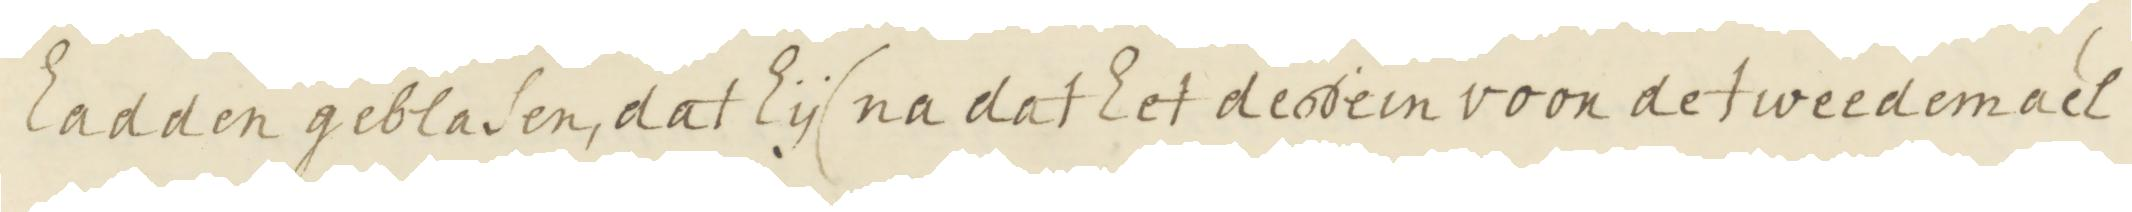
hadden geblasen, dat hij (na dat het dessein voor de tweedemael
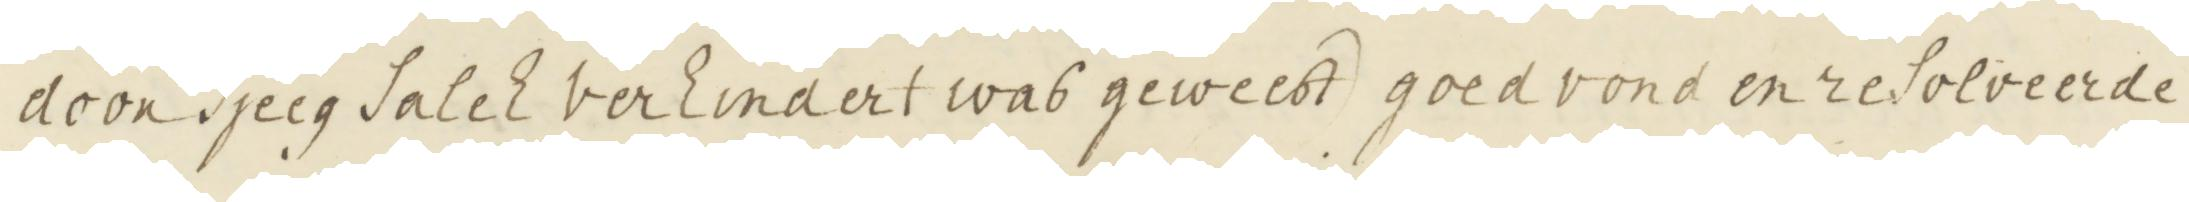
door sjeeg saleh verhindert was geweest) goed vond en resolveerde
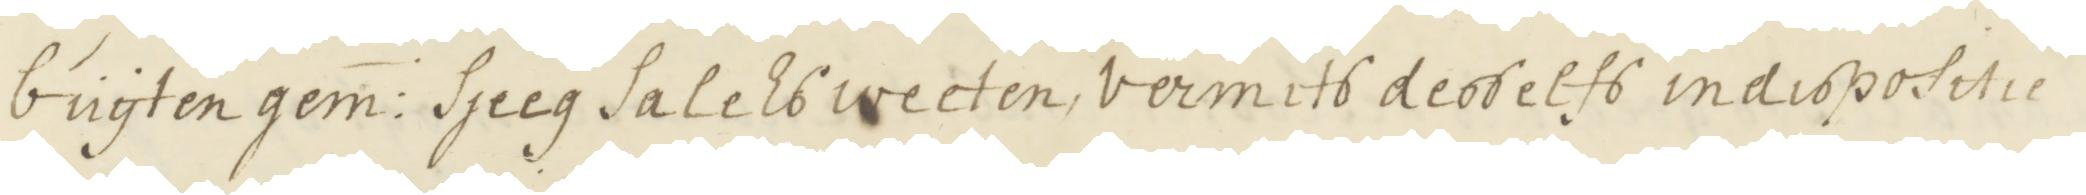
buijten gem: sjeeg salehs weeten, vermits desselfs in dispositie
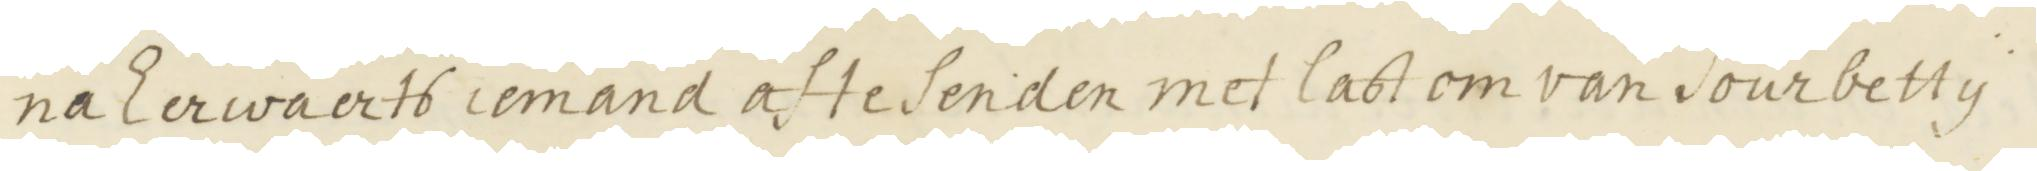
na herwaerts iemand afte senden met last om van Tourbettij
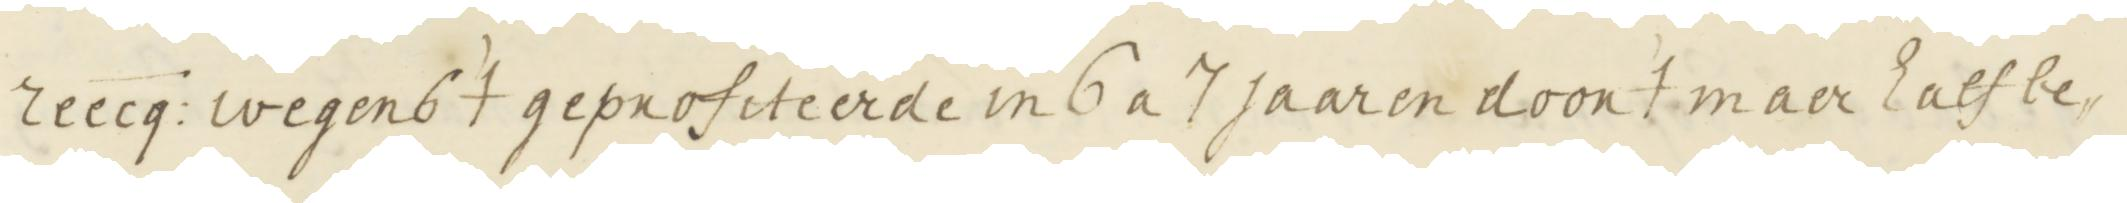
reecq: wegens ’t geprofiteerde in 6 a 7 jaaren door ’t maer half be„
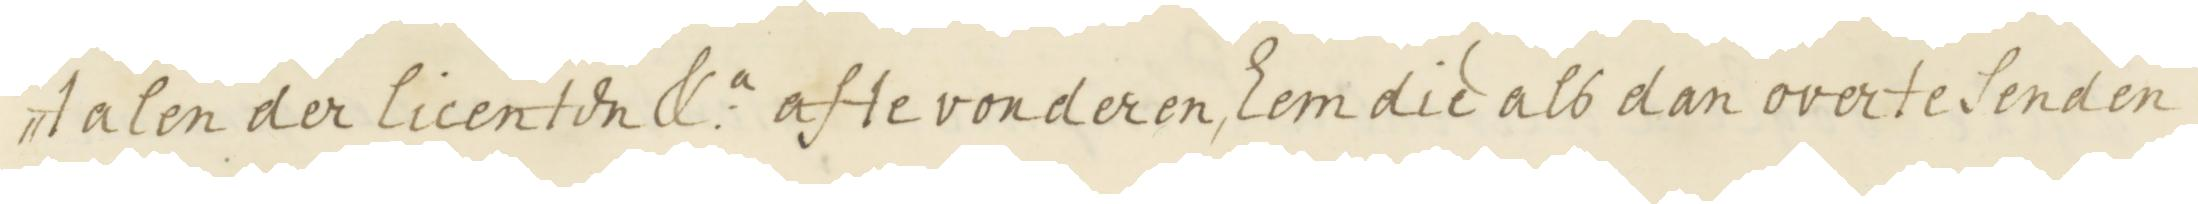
„talen der licenten &:a afte vorderen, hem die als dan over te senden
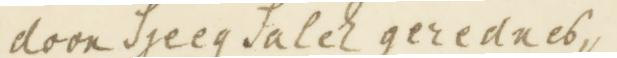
door sjeeg saleh geredres„
